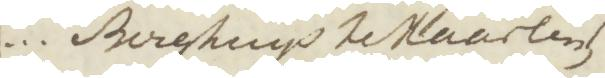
. . . Berghuys te Haarlem
